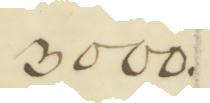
3000.
